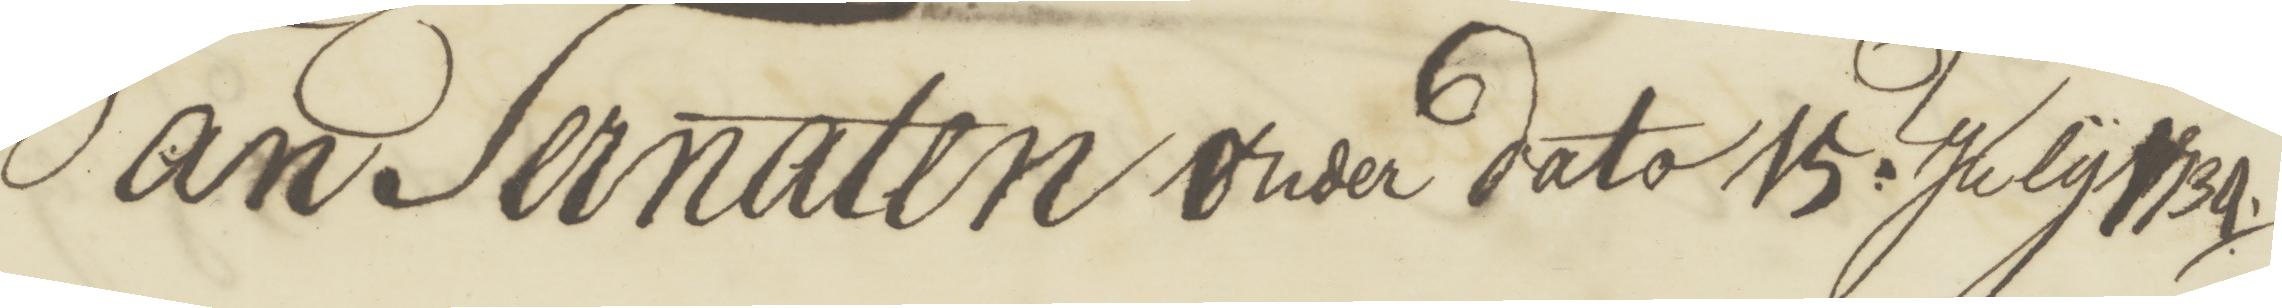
Van Ternaten onder dato 15: Julij 1734.
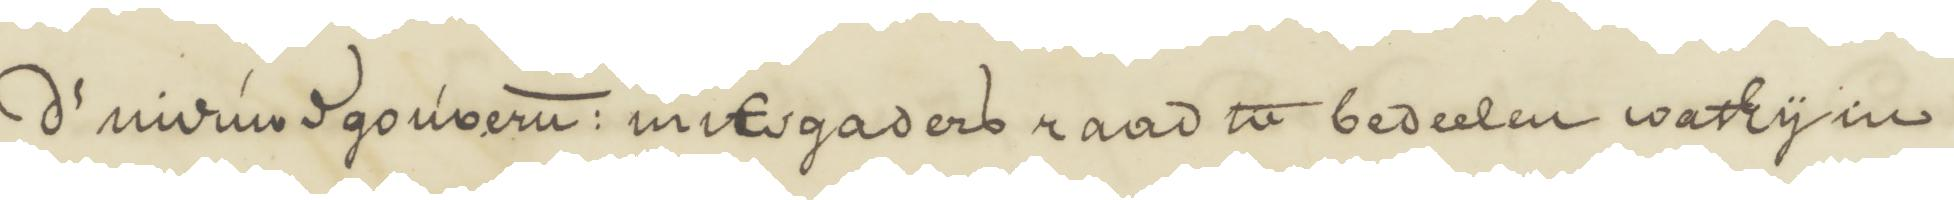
d’ nieuwe gouvern: mitsgaders raad te bedeelen wathij in
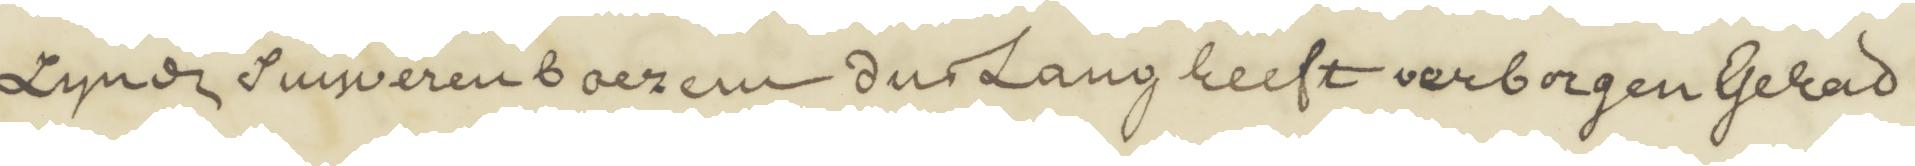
zynen suiveren boezem duslang heeft verborgen Gehad
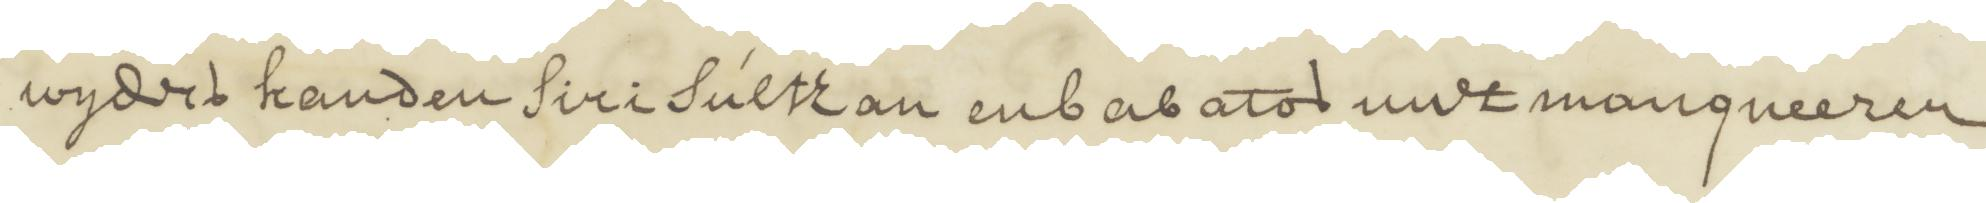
wyders kanden siri sulthan en babatos niet manqueeren
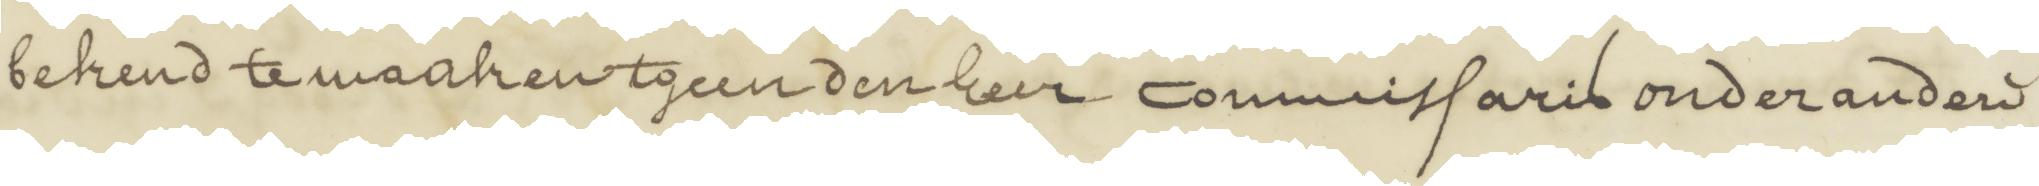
bekend te maaken tgeen den heer commissaris onder andere
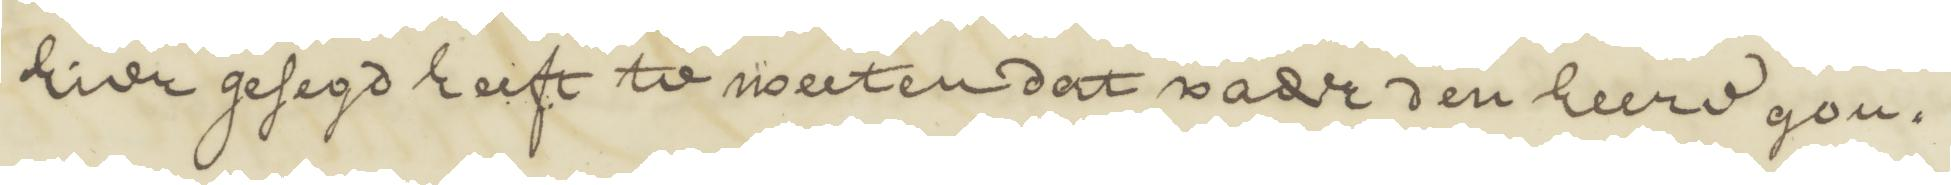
hier gesegd heeft te weeten dat vader den heere gou„
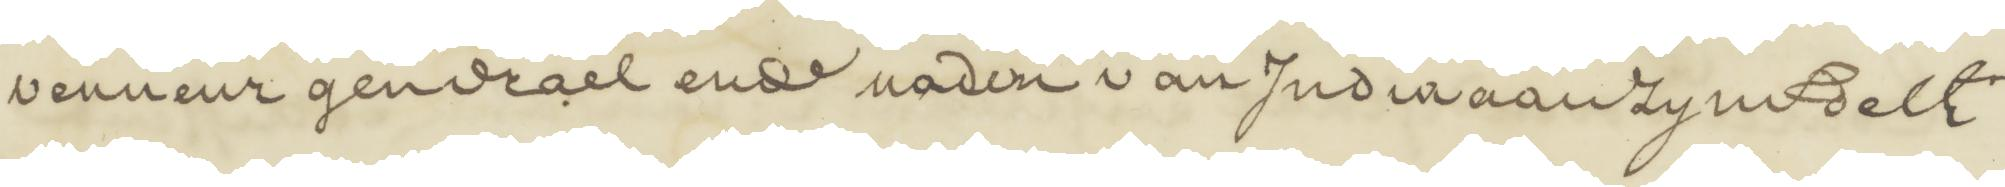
verneur generael ende raden van Jndia aan zyn Edelht
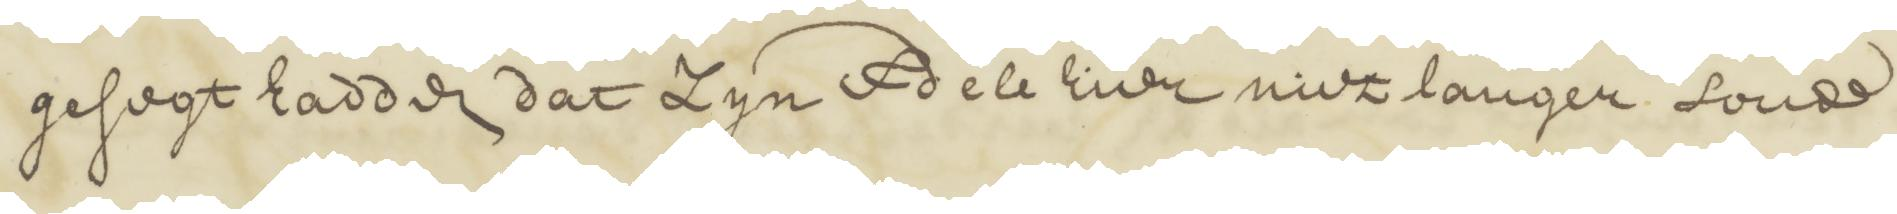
gesegt hadden dat zyn Edele hier niet langer soude
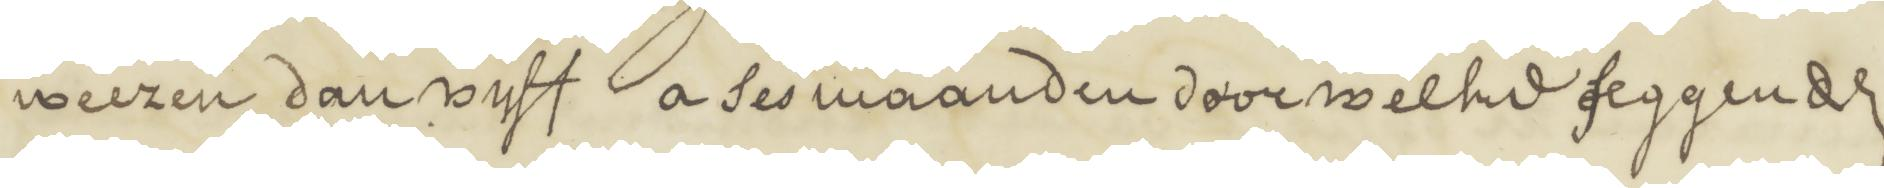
weezen dan vyff a ses maanden door welke seggen den
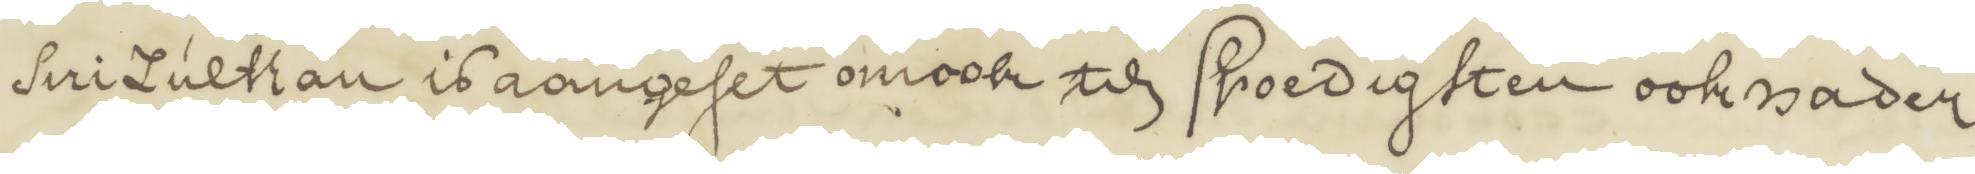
siri zulthan is aangeset om ook ten spoedigsten ook vader
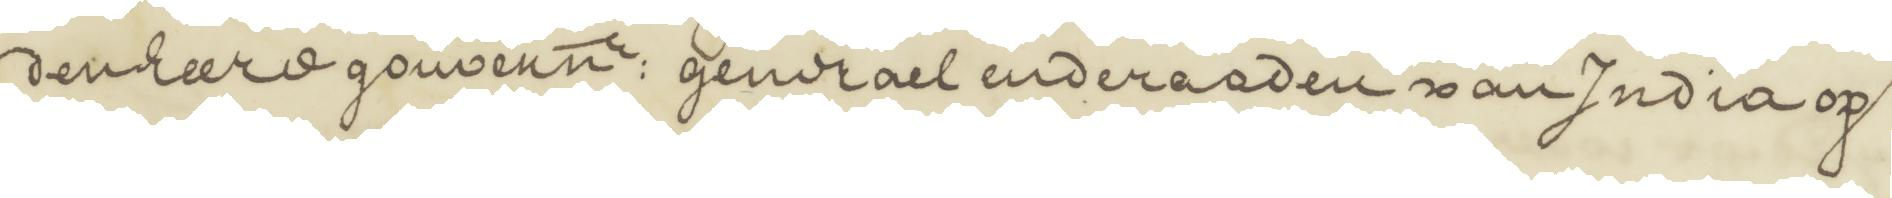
den heere gouvern:r generael ende raaden van Jndia op
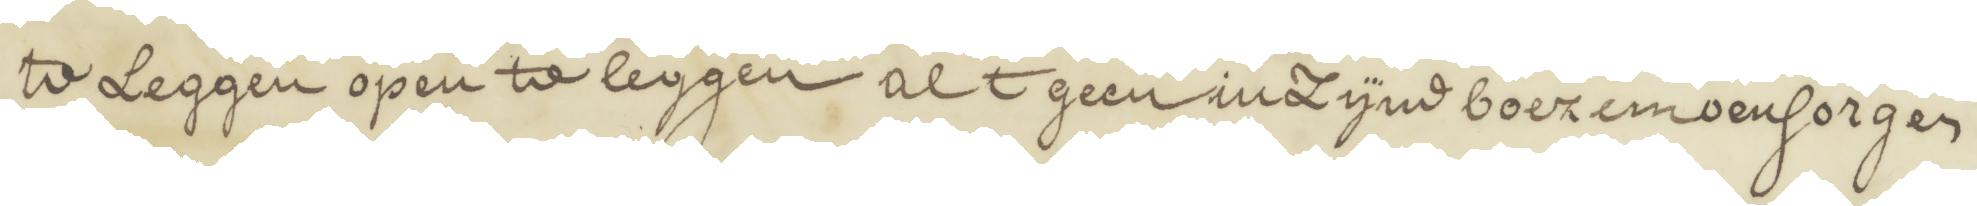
te leggen open te leggen al t geen in zijne boezem versorgen
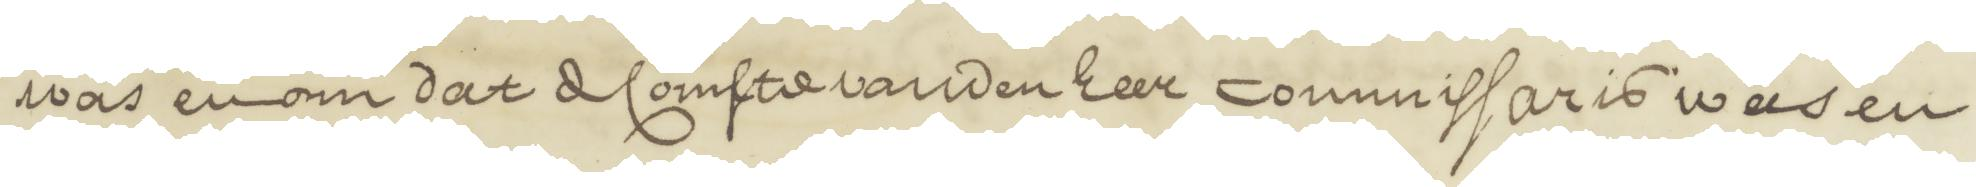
was en om dat de Comste van den heer commissaris was en
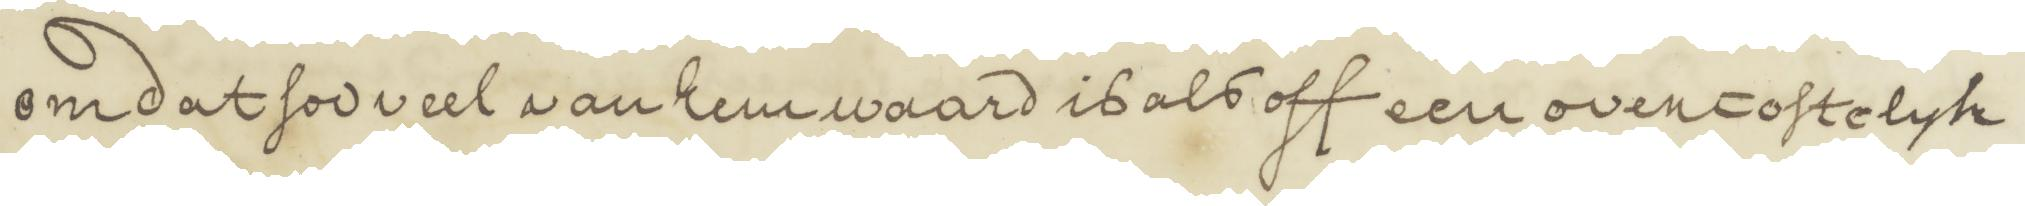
om dat soo veel van hem waard is als off een overcostelyk
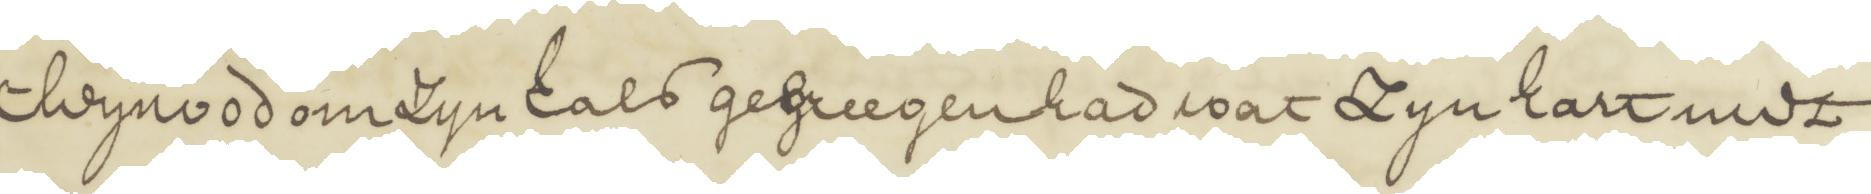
cleynood om zyn hals gekreegen had wat zyn hart met
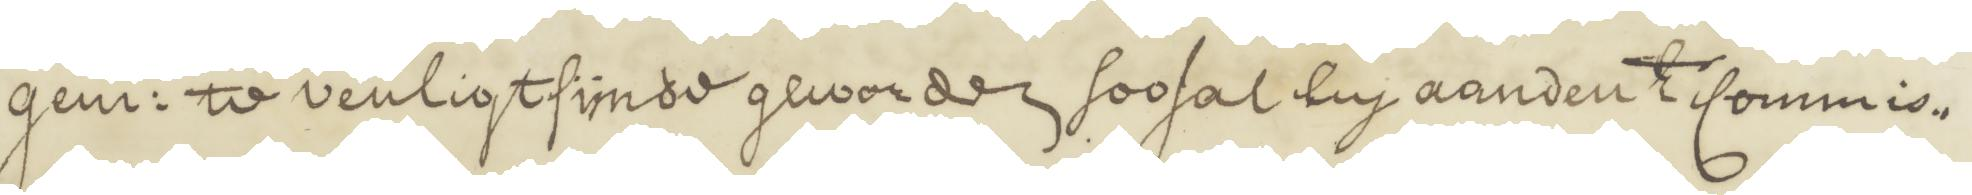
gem: te verligt sijnde geworden soo sal hy aan den hr Commis„
